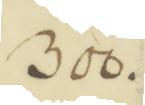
300.
